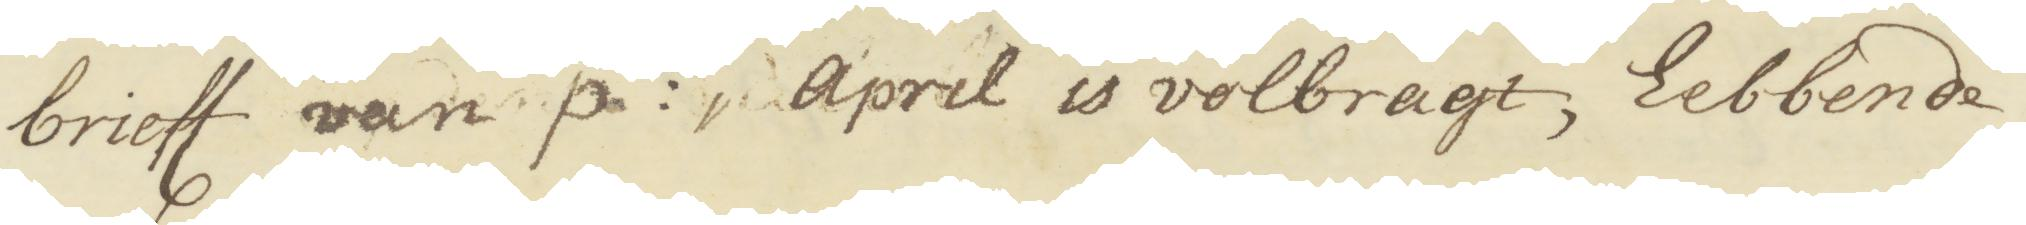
brieff van p:„mo April is volbragt, hebbende
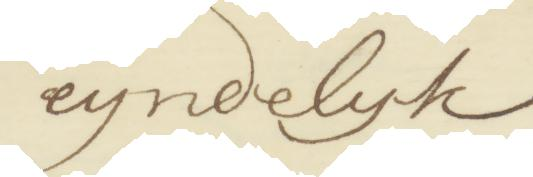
eyndelyk
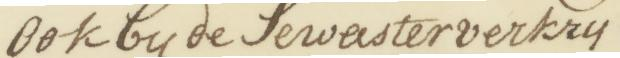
ook by de sewaster verkry
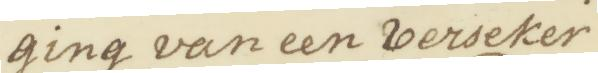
ging van een verseker
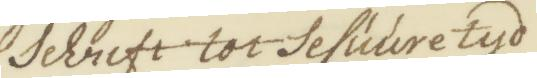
schrift tot secuure tyd
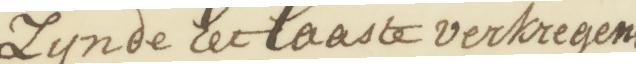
zynde het laaste verkregen
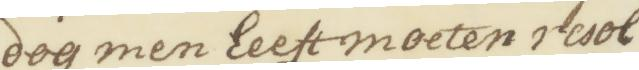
dog men heeft moeten resol
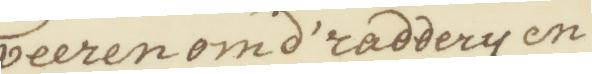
veeren om d’ raddery en
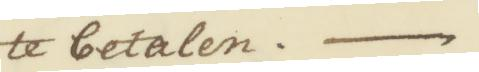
te betalen. —
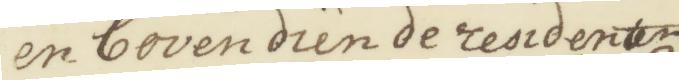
en boven dien de residenten
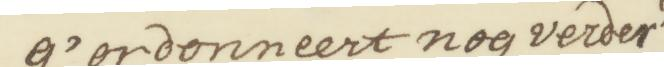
g’ordonneert nog verder
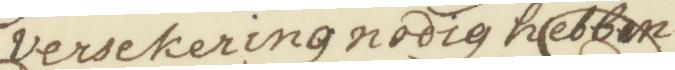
versekering nodig hebben
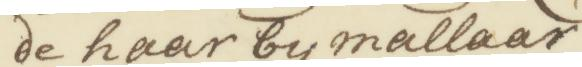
de haar by mallaar
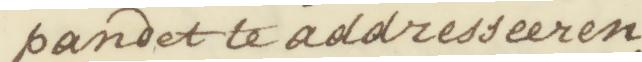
pandet te addresseeren
